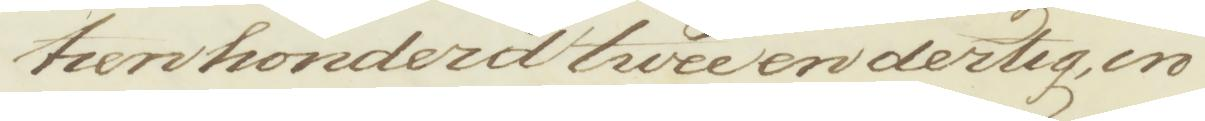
tien honderd twee en dertig, in
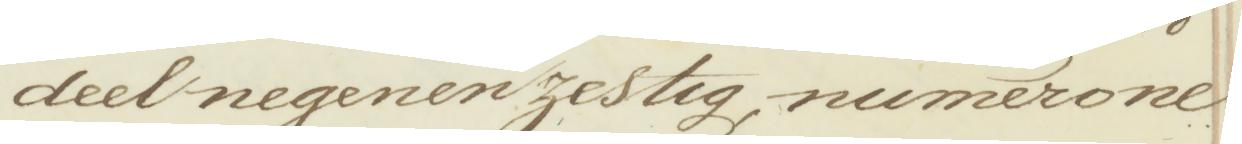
deel negenen zestig, numero ne„
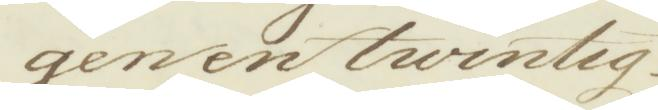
gen en twintig
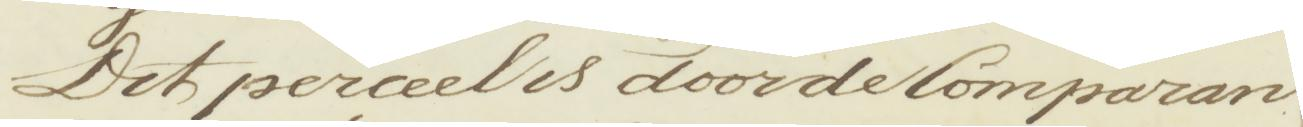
Dit perceel is door de Comparan,
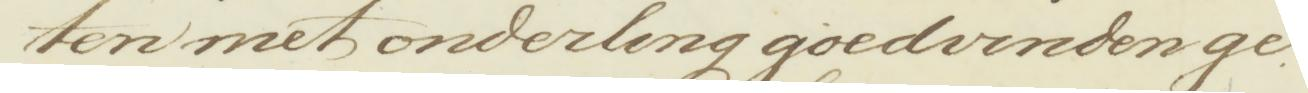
ten met onderling goedvinden ge,
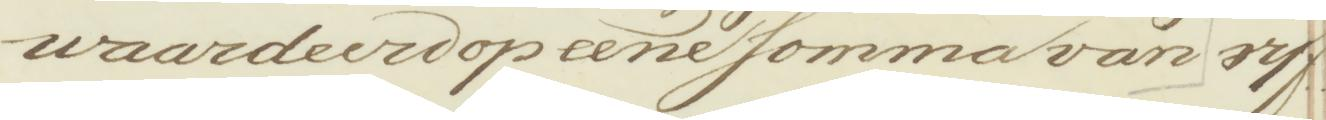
waardeerd op eene somma van vyf„
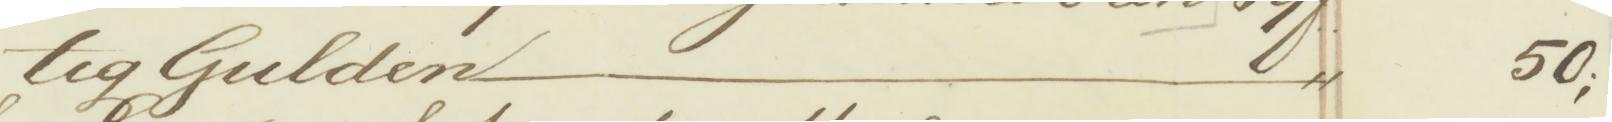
tig Gulden —„ 50;
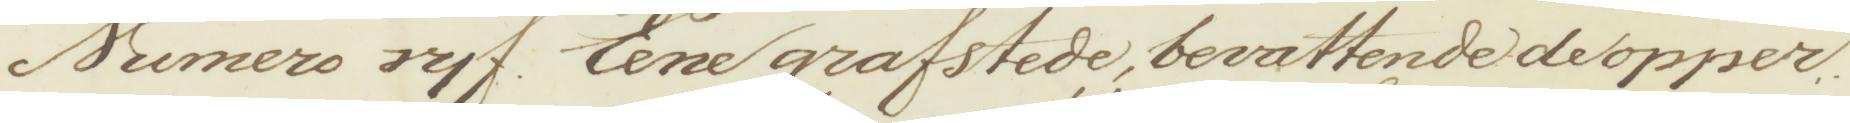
Numero vyf Eene grafstede, bevattende de opper„
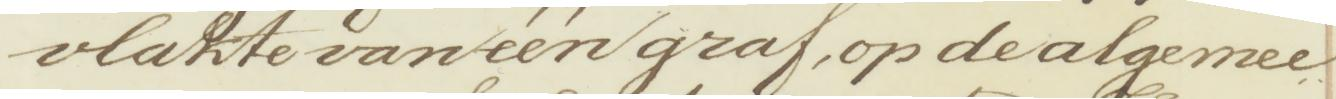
vlakte van één graf, op de algemee„
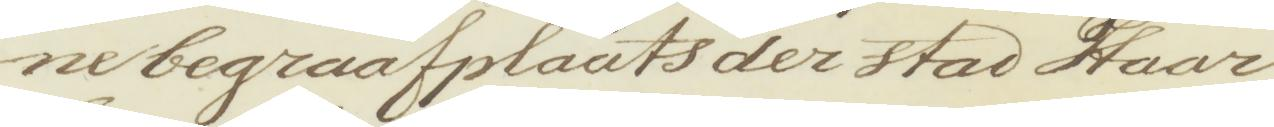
ne begraafplaats der stad Haar
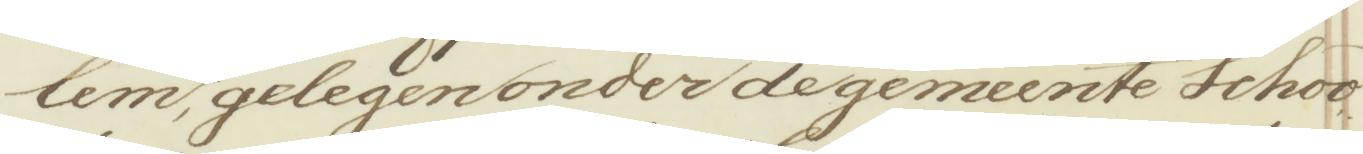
lem, gelegen onder de gemeente Schoo„
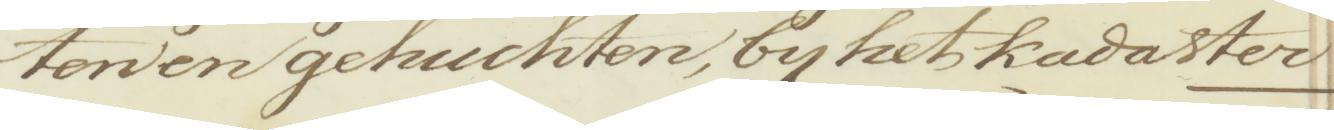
ten en gehuchten, by het kadaster
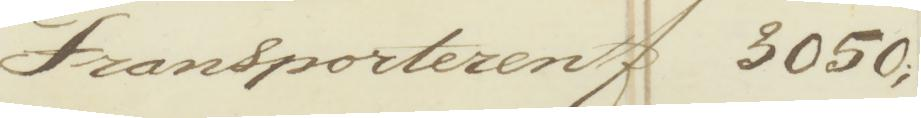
Transporteren ƒ 3050;
